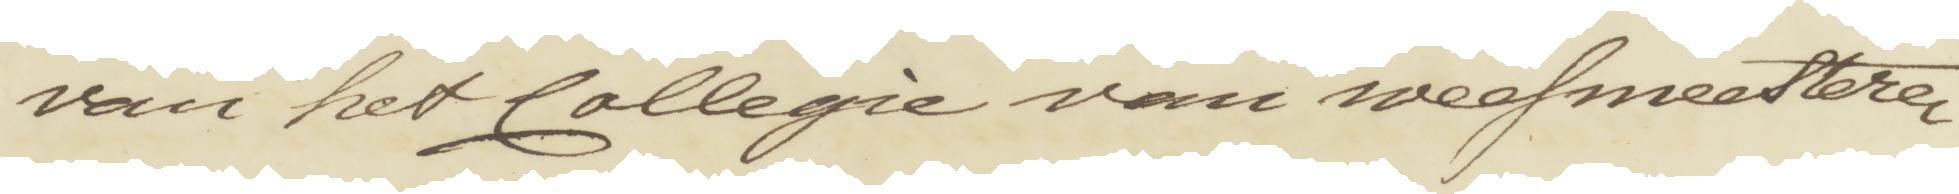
van het Collegie van weesmeesteren
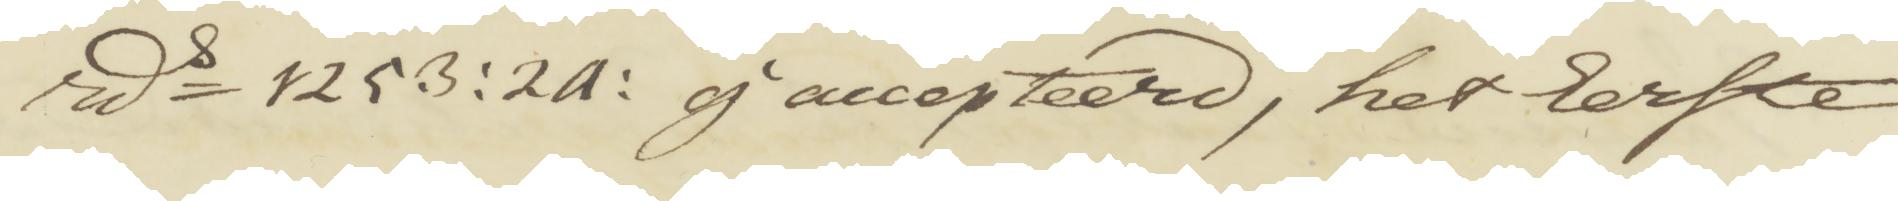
rd=s 125.3:24: g’accepteerd, het Eerste
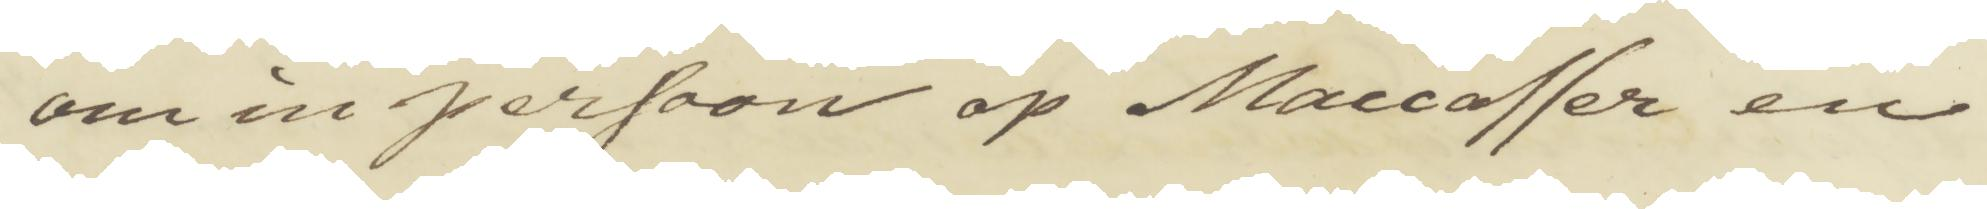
om in persoon op Maccasser en
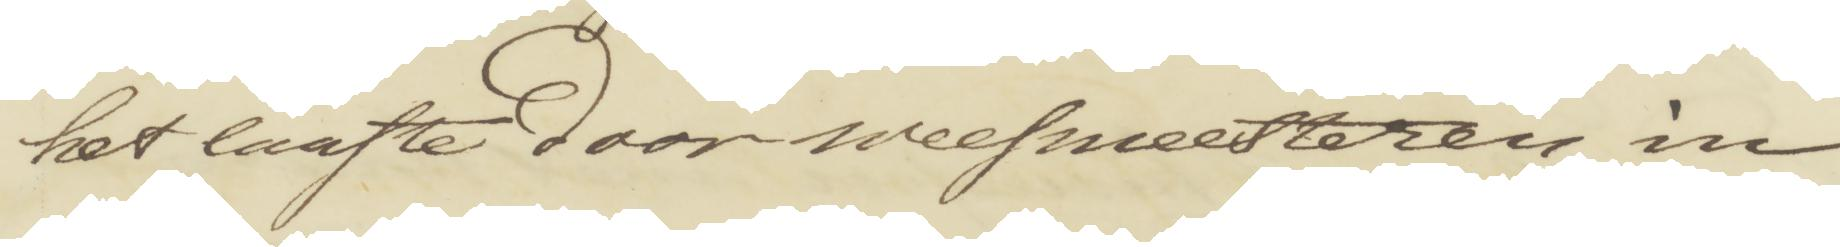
het laaste door weesmeesteren in
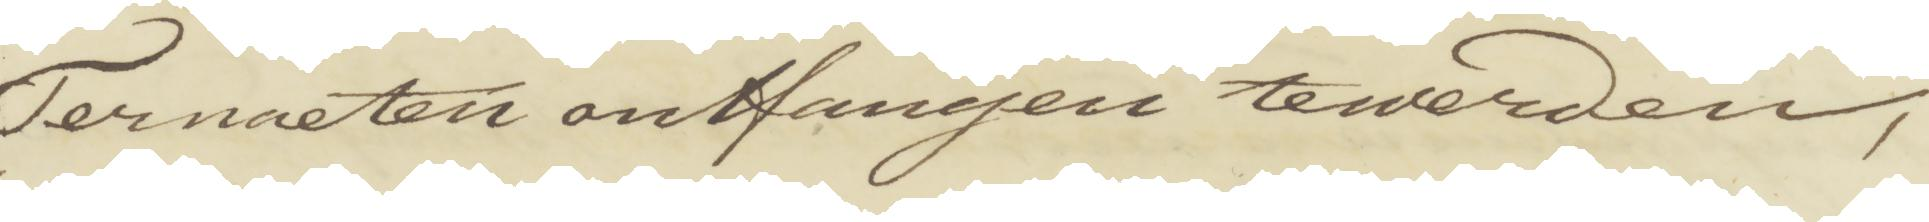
Ternaeten ontfangen te werden,
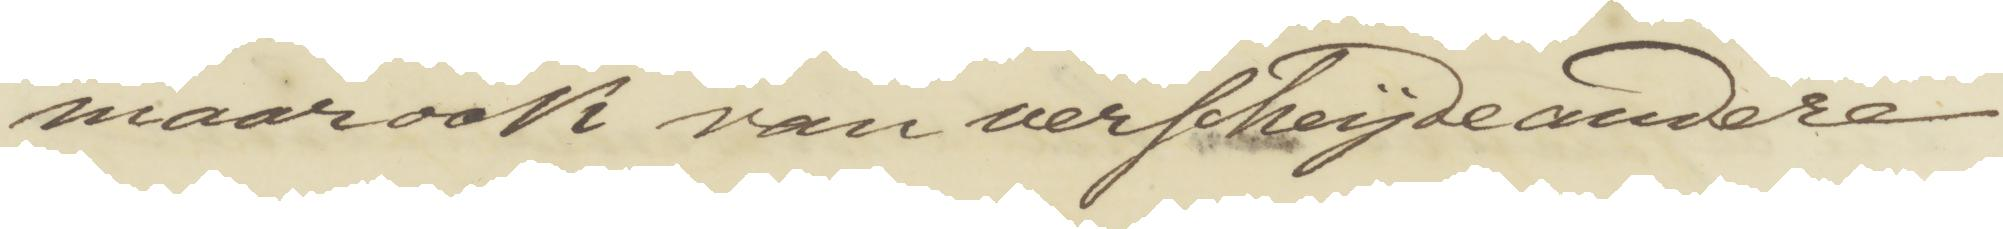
maar ook van verscheijde andere
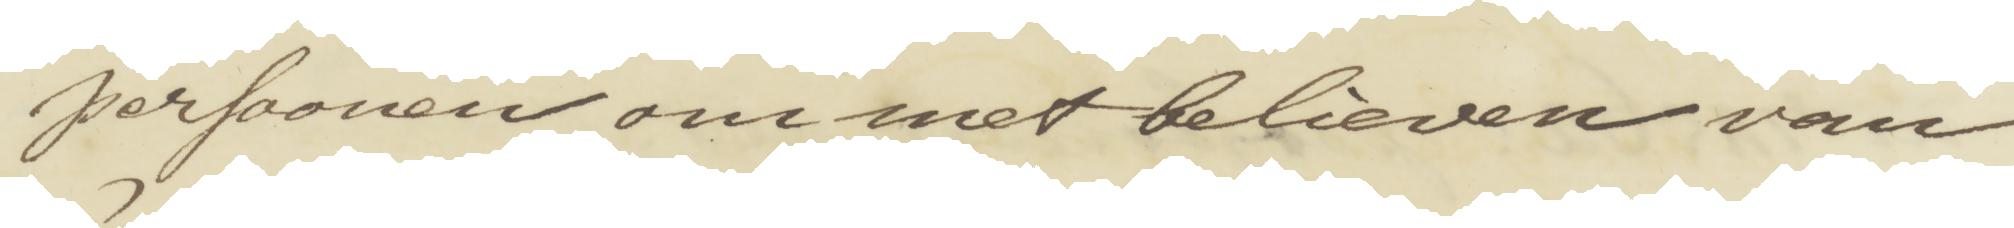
persoonen om met believen van
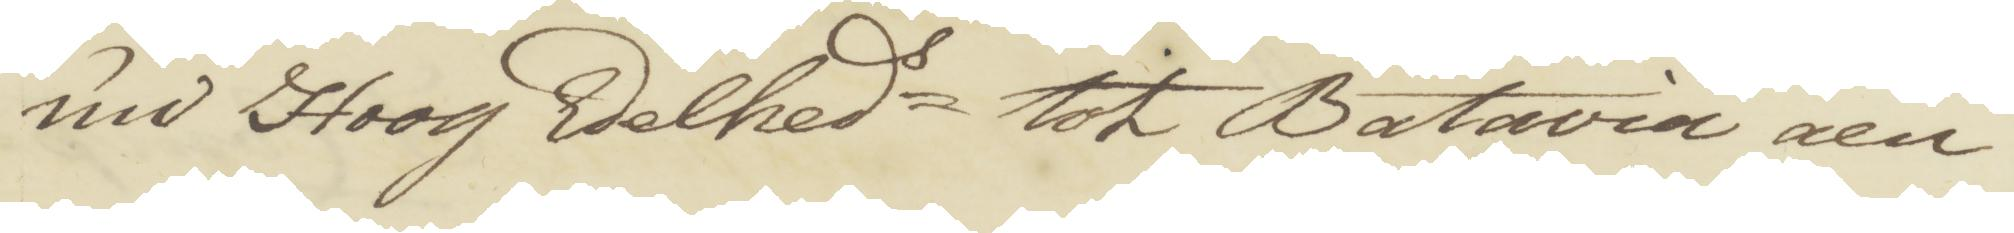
uw Hoog Edelhed=s tot Batavia aen
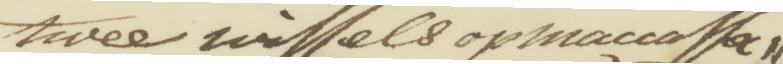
twee wissels op maccasser
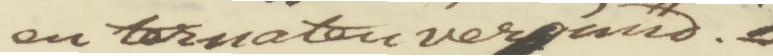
en ternaten vergund.
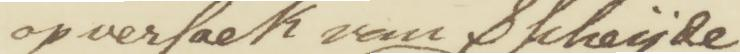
op versoek van verscheijde
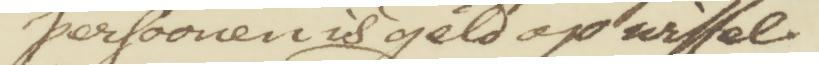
persoonen is geld op wissel
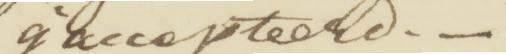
g’accepteerd. —
